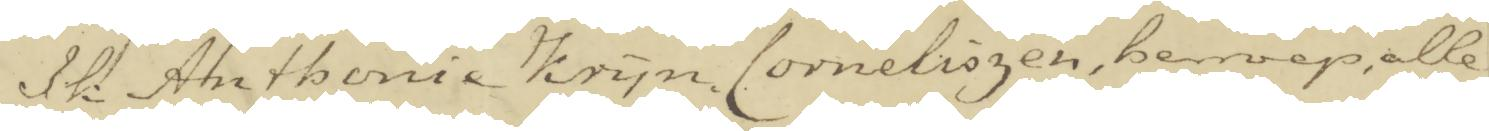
Ik Anthonie Krijn, Corneliszen, herroep, alle
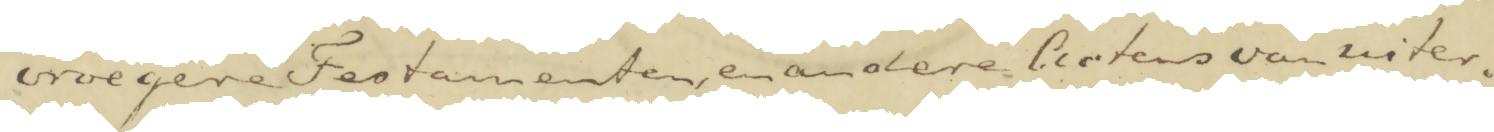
vroegere Testamenten, en anderen Actens van uiter„
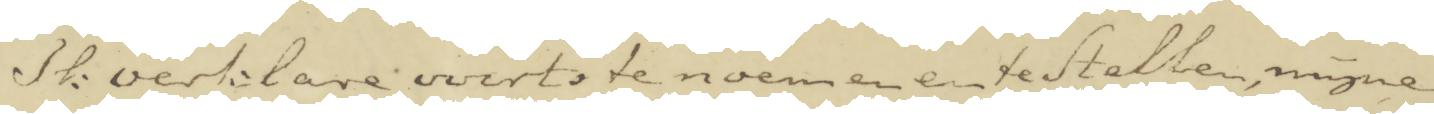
Ik verklare voorts te noemen en te stellen, mijne
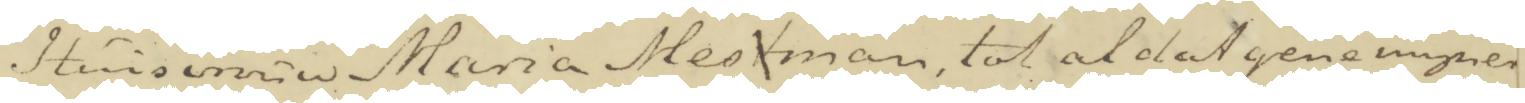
Huisvrouw Maria Mestman, tot al dat gene myner
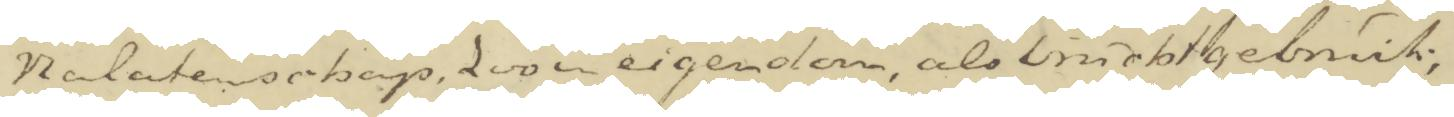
Nalatenschap, zoo in eigendom, als vruchtgebruik;
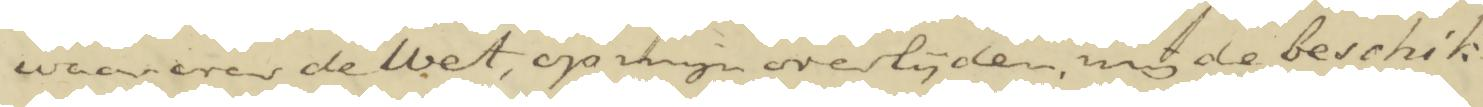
waarover de Wet, op mijn overlijden, mij de beschik
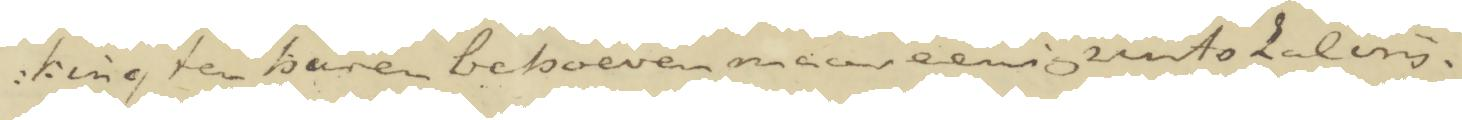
king ten haren behoeven maar eenigzints zal vrij„
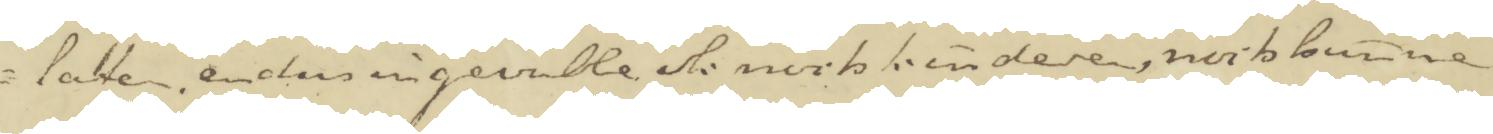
=laten, en dus in gevalle ik noch kinderen, noch hunne
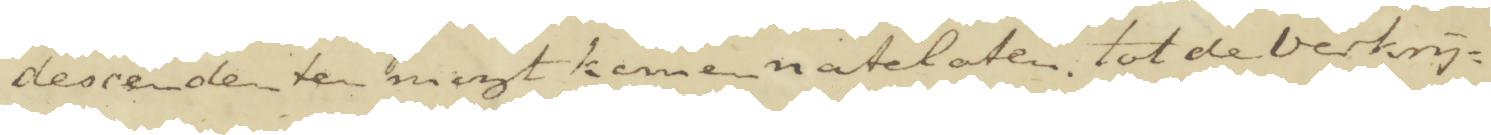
descendenten mogt komen natelaten, tot de verkrij=
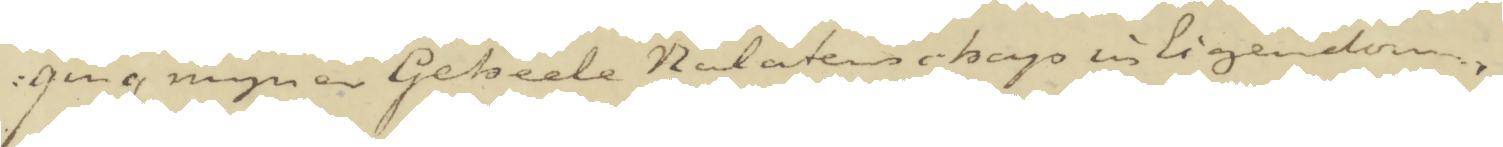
=ging myner Geheele Nalatenschap in Eigendom,
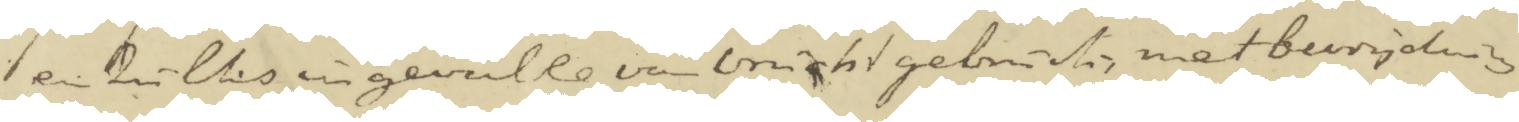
ten zulks ingevalle van vrucht gebruik; met bevrijding
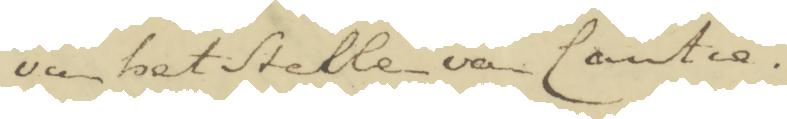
van het stellen van Cautie.
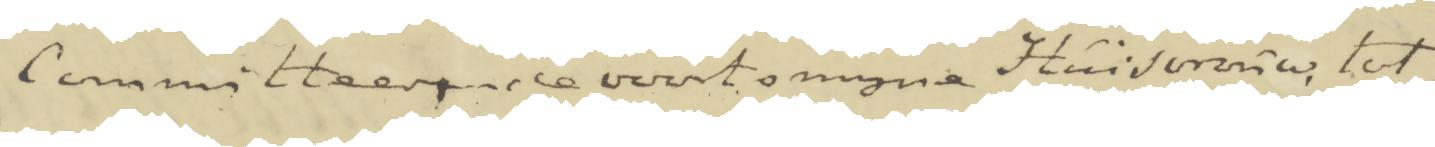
Committeerende voorts myne Huisvrouw, tot
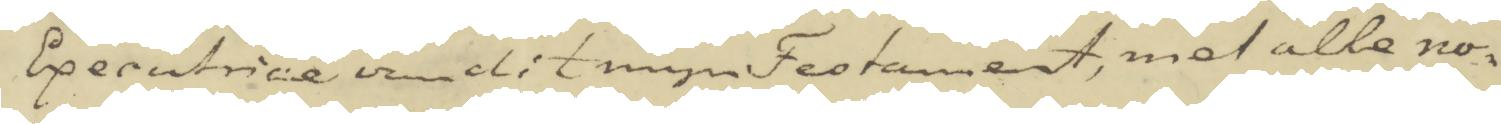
Executrice van dit myn Testament, met alle no„
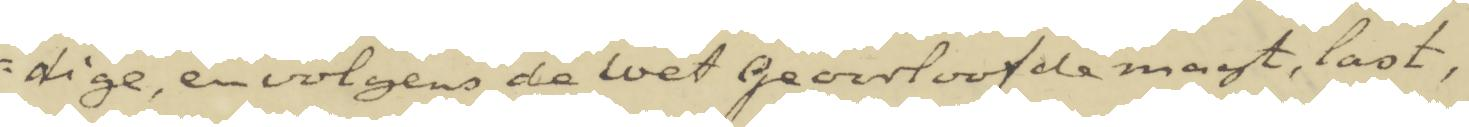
=dige, en volgens de wet geoorloofde magt, last,
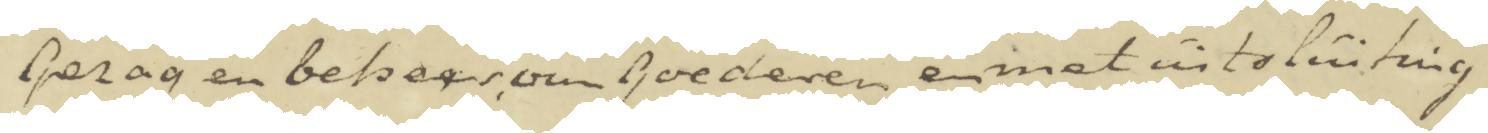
Gezag en beheer, van Goederen en met uitsluiting
